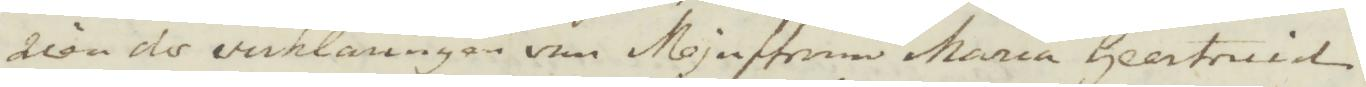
ziende verklaringen van Mejuffrouw Maria Geertruid
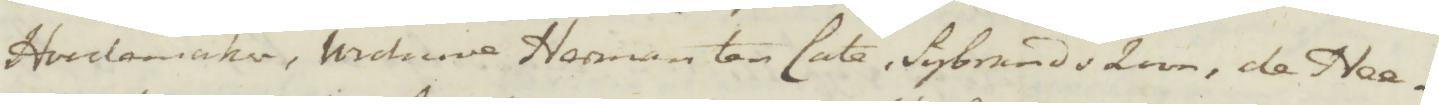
Hoedemaker, Weduwe Herman ten Cate, Sijbrands Zoon, de Hee=
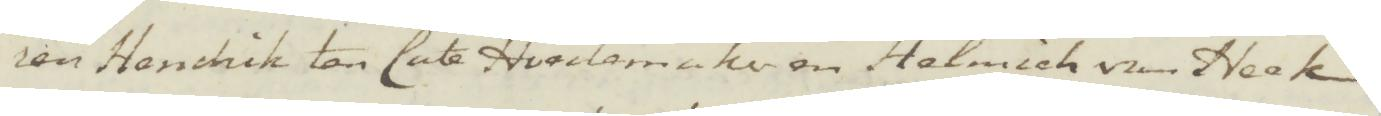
ren Hendrik ten Cate Hoedemaker en Helmich van Heek,
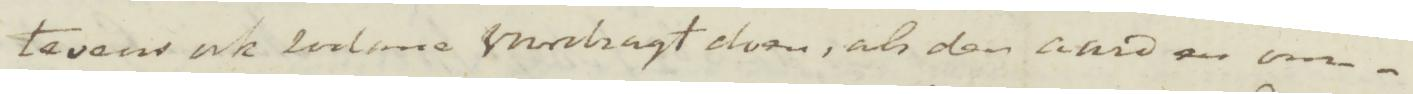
tevens ook zodane voordragt doen, als den aard en om-
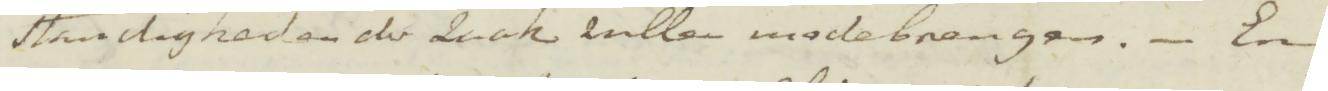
standigheden de zaak zullen medebrengen. — En
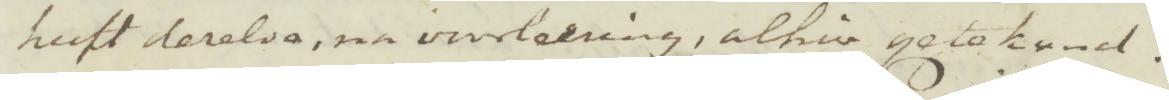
heeft dezelve, na voorleezing, alhier getekend.
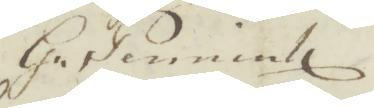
G: Pennink
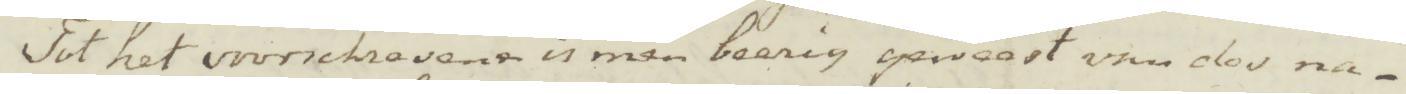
Tot het voorschrevene is men beezig geweest van des na-
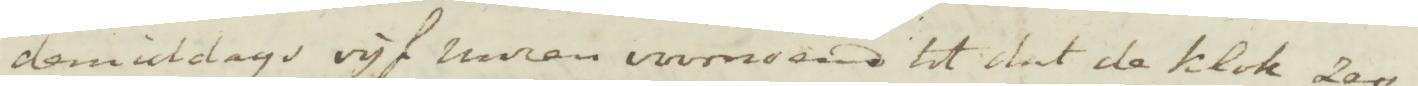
demiddags vijf uuren voornoemd tot dat de klok zes
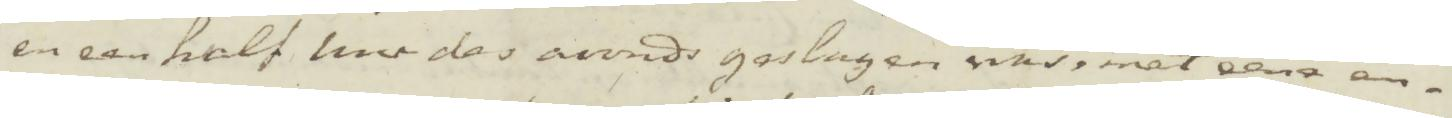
en een half uur des avonds geslagen was, met eene en=
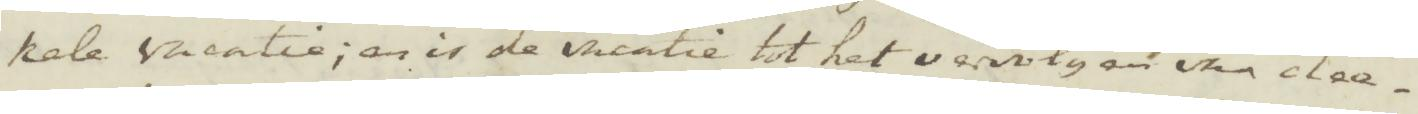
kele vacatie; en is de vacatie tot het vervolgen van dee-
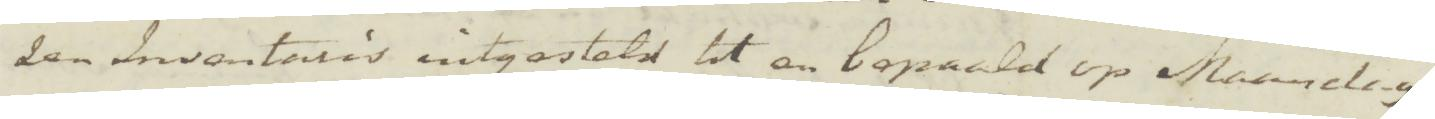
zen Inventaris uitgesteld tot en bepaald op Maandag
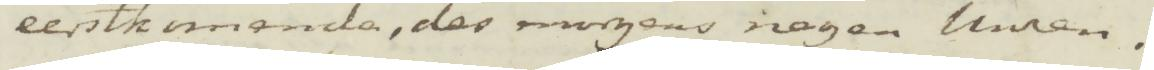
eerstkomende, des morgens negen uuren,
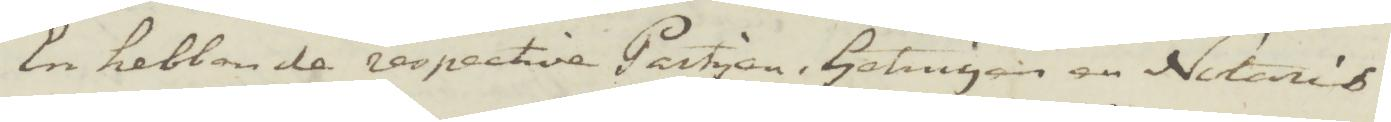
En hebbende respective Partijen, Getuigen en Notaris
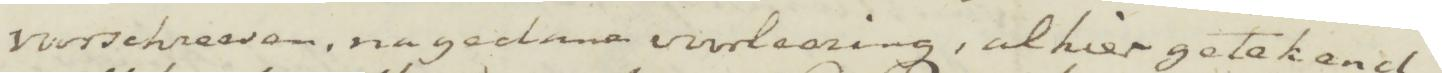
voorschreeven, na gedane voorleezing, alhier getekend
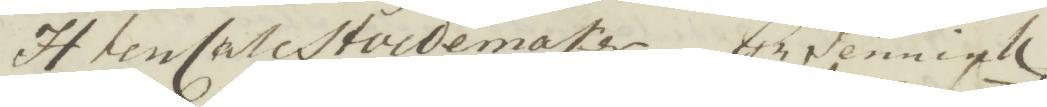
H ten Cate Hoedemaker Gr Pennink
